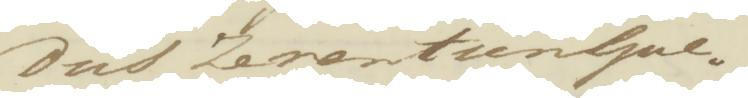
dus Zeventien Gul„
